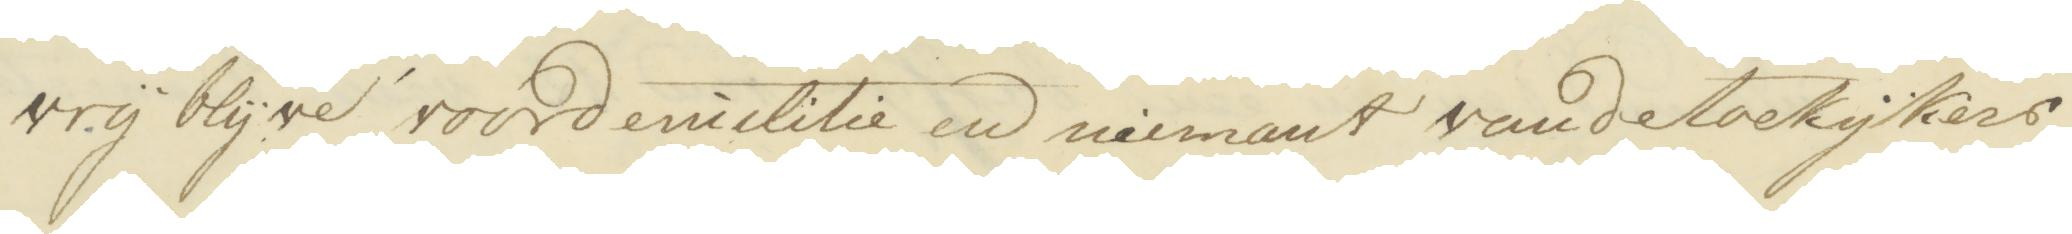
vrij blijve voordemilitie en niemant van de toekijkers
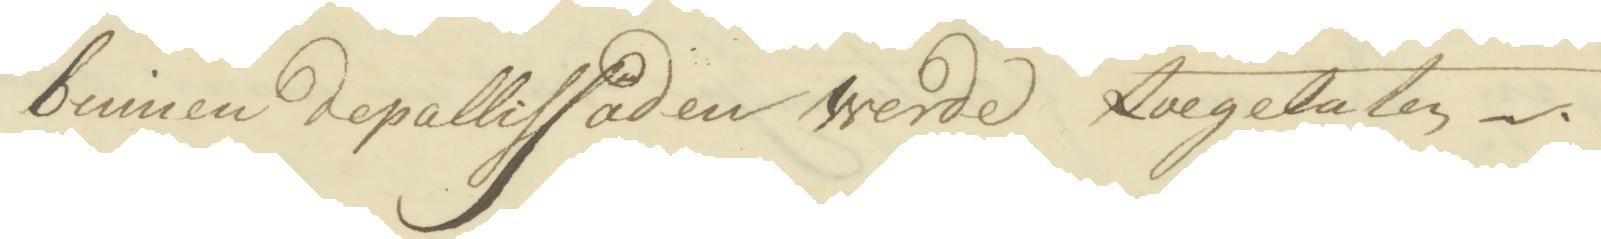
binnen depallissaden werde toegelaten —.
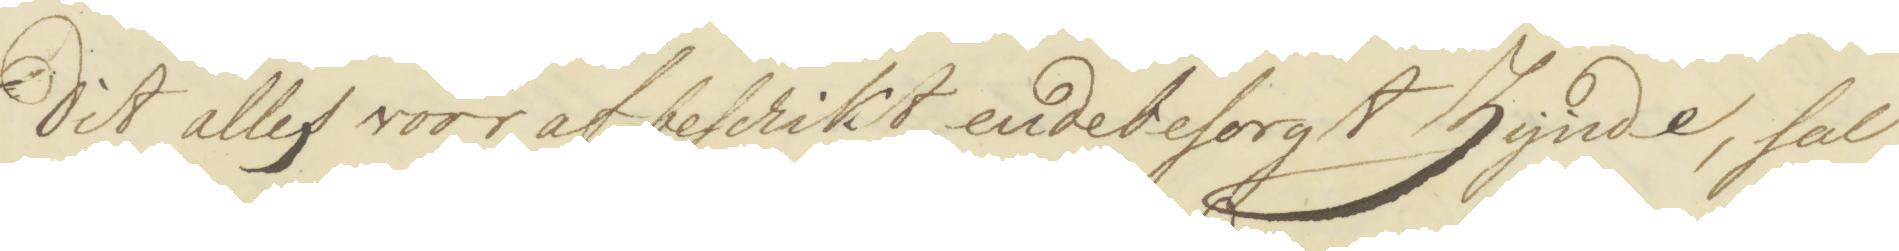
dit alles voor af beschikt en debesorgt zijnde, sal
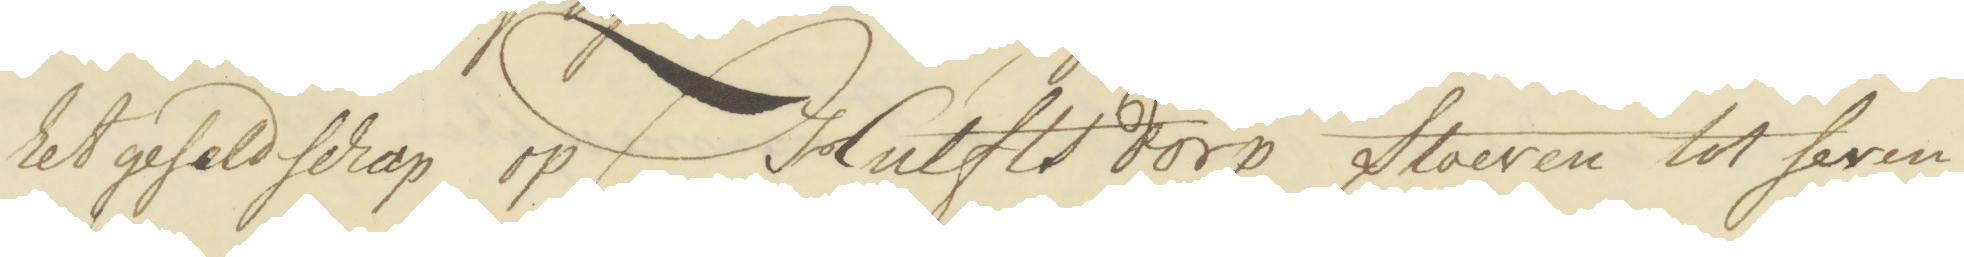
het geseldschap op Hulfts dorp vertoeven tot seven
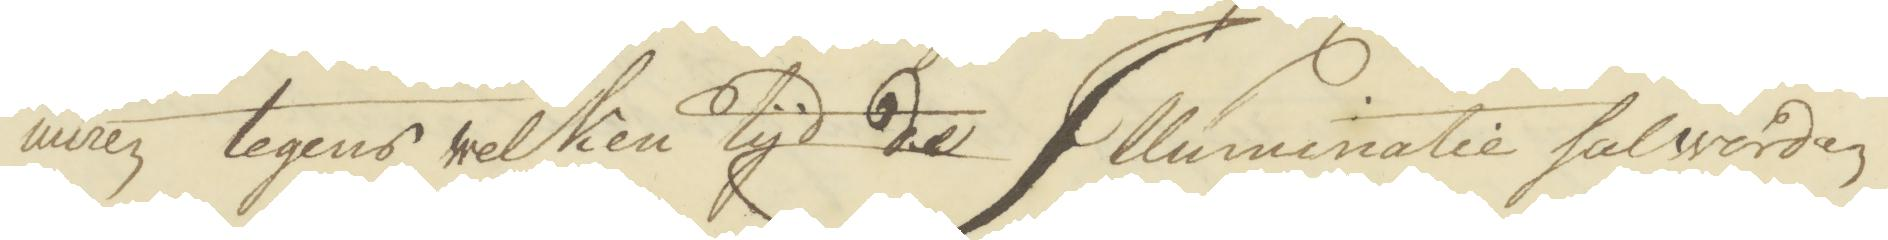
uuren tegens welken tijd de Jlluminatie salworden
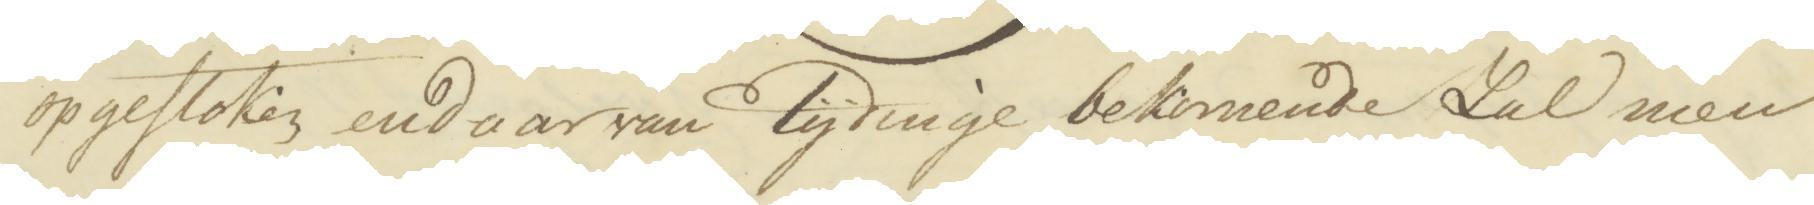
op gestoken en daar van tijdinge bekomende zal men
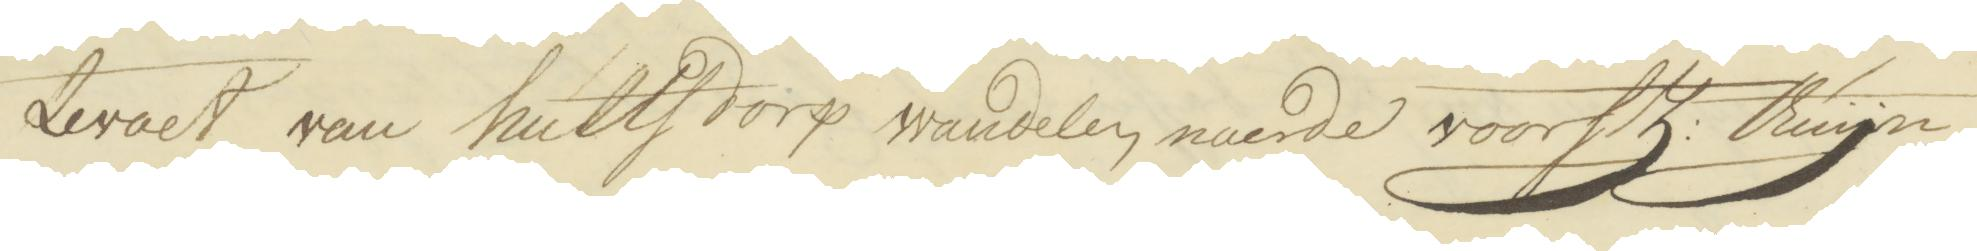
tevoet van hultsdorp wandelen naerde voorsz: thuijn
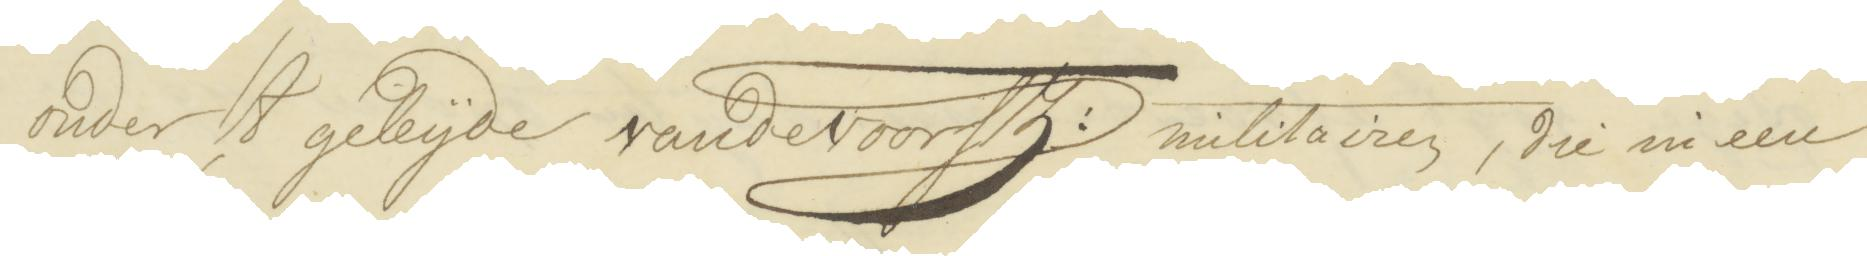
onder 't geleijde vandevoorsz: militairen, die in een
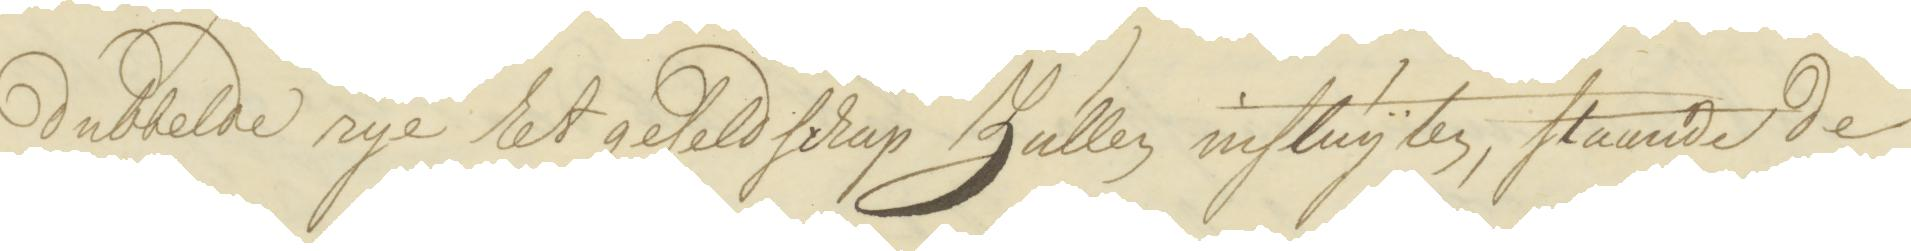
dubbelde rije het geseldschap zullen insluijten, staande de
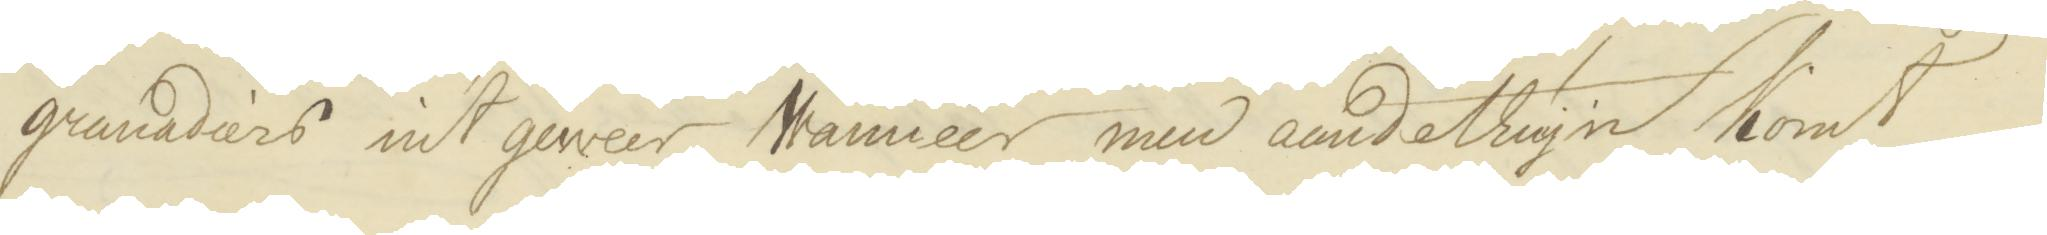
granadiers in’t geweer Wanneer men aan dethuijn komt
